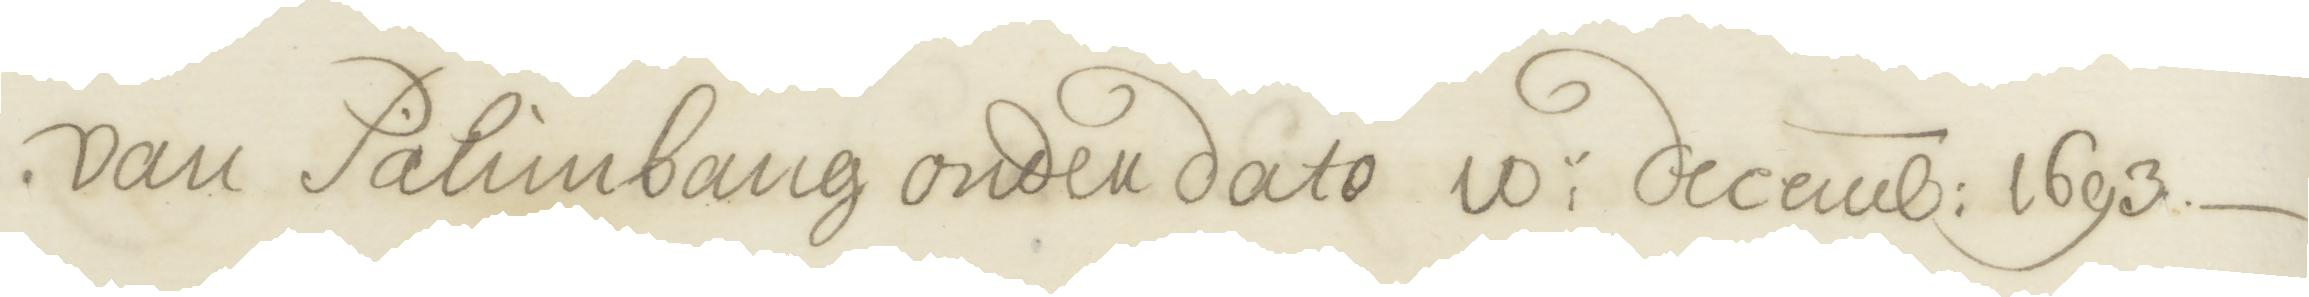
Van Palimbang onder dato 10:' decemb: 1693. —
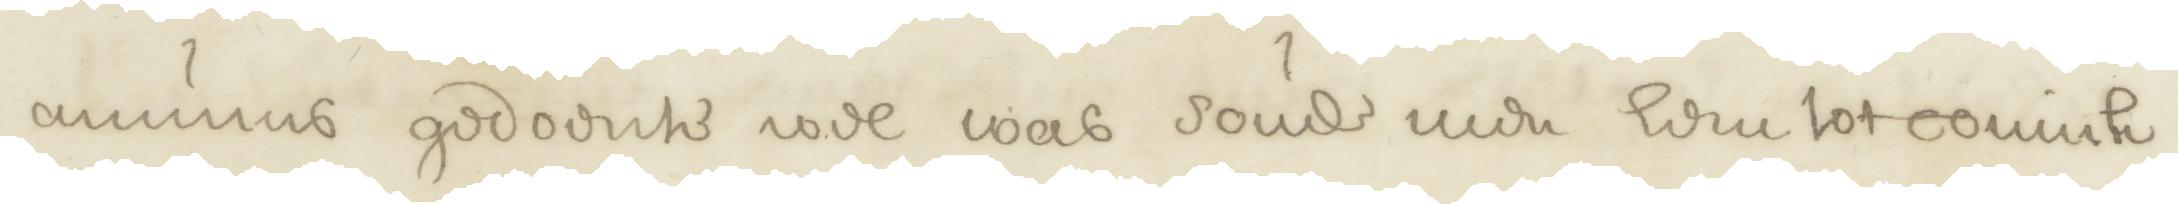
amums gedoente wel was soude men hem tot conink
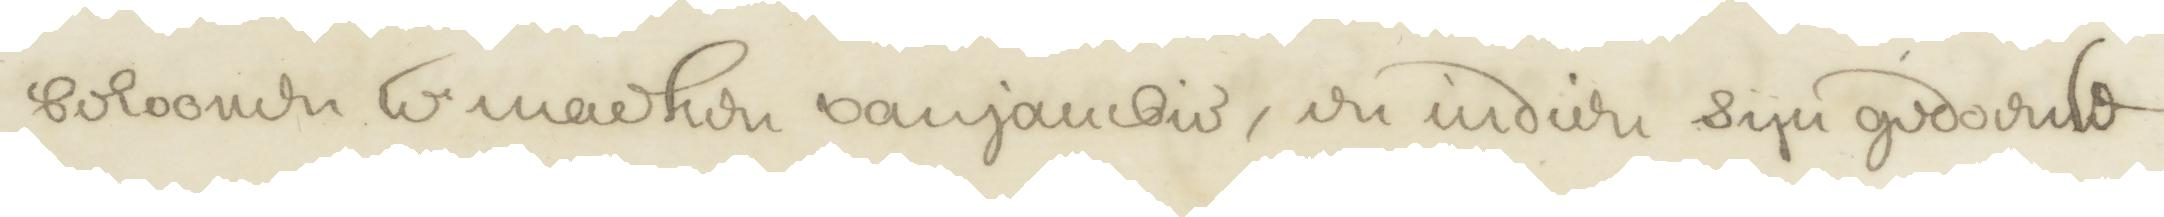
behooren te maeken van jambie, en indien sijn gedoente
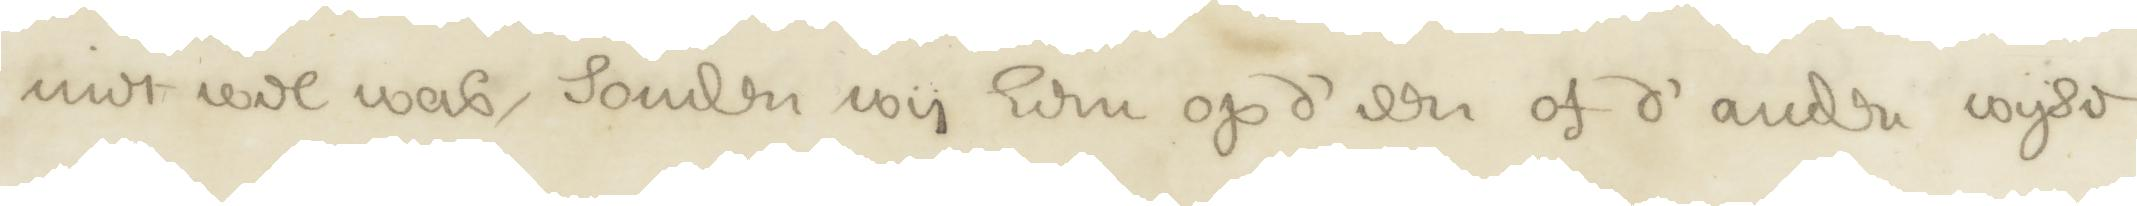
niet wel was, souden wij hem op d’ een of d’ ander wijse
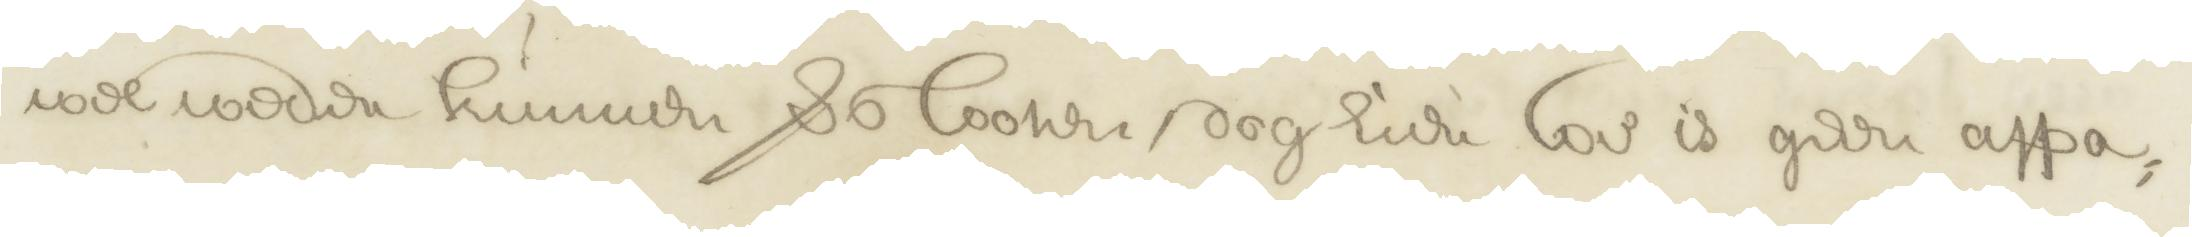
wel weder kunnen verstooten, dog hier toe is geen appa„
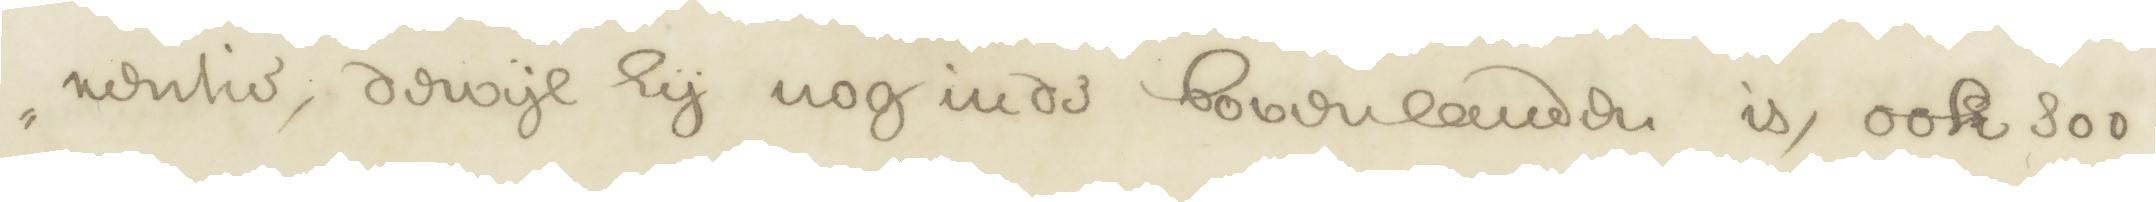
„rentie; dewijl hij nog inde bovenlanden is, ook soo
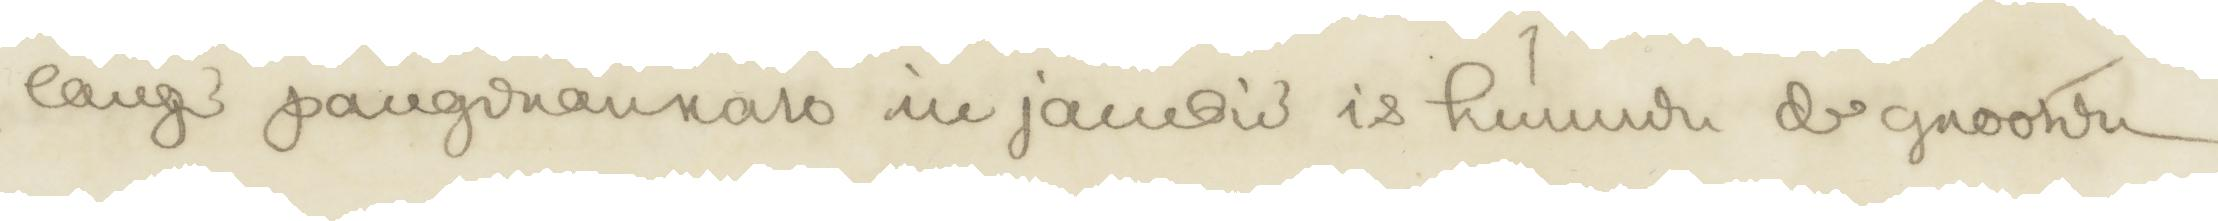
lange pangeranrato in jambie is kunnen de grooten
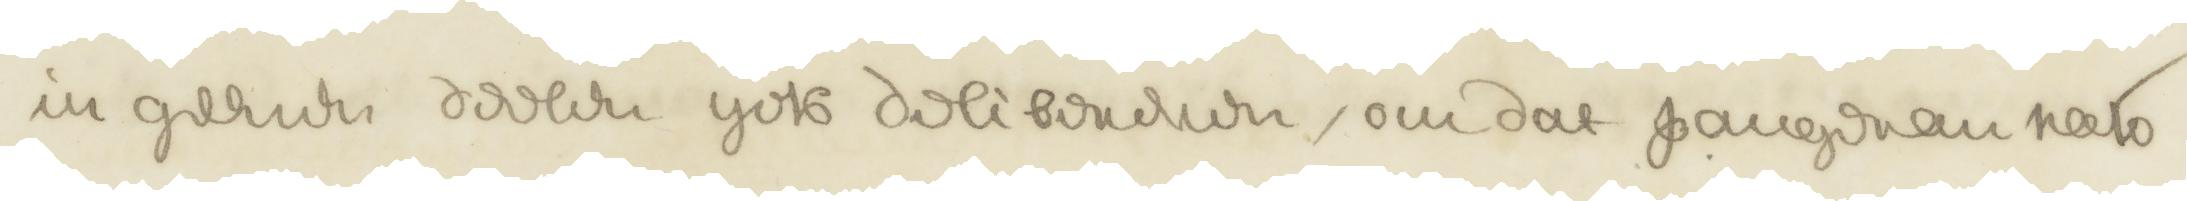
in geenen deelen ijets delibereren, om dat pangeran rato
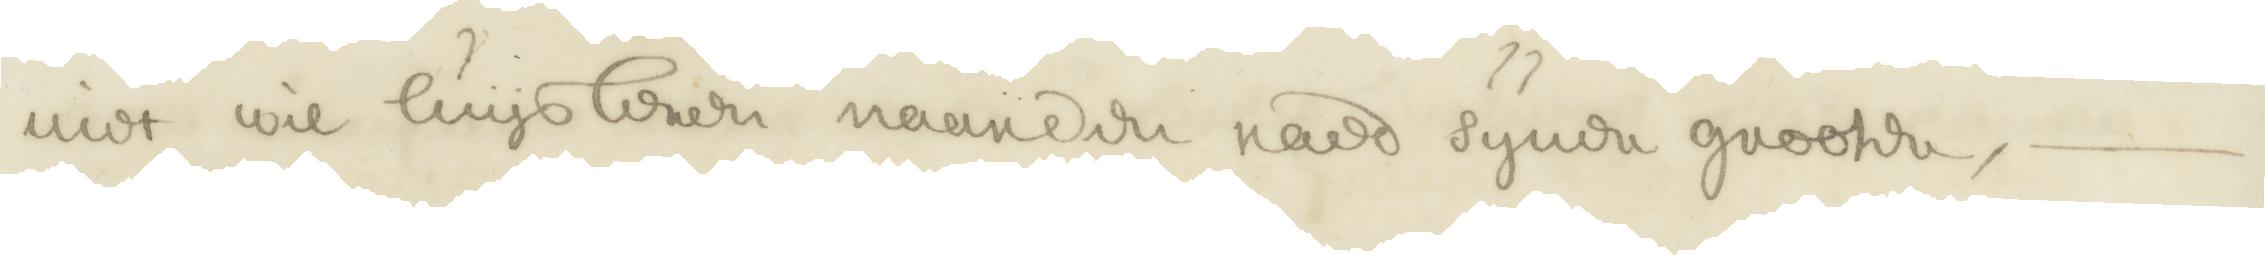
niet wil luijsteren naar den raed sijner grooten, —
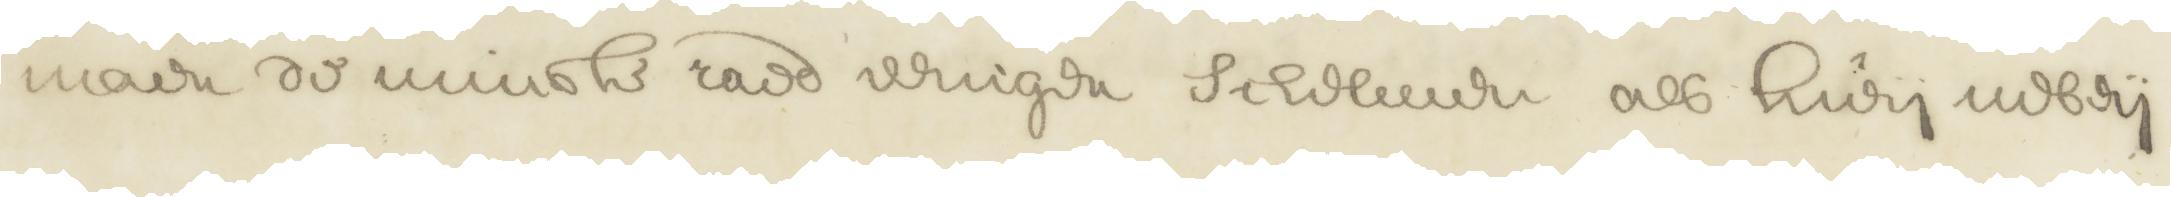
maer de minste raed eeniger schelmen als kieij nebeij
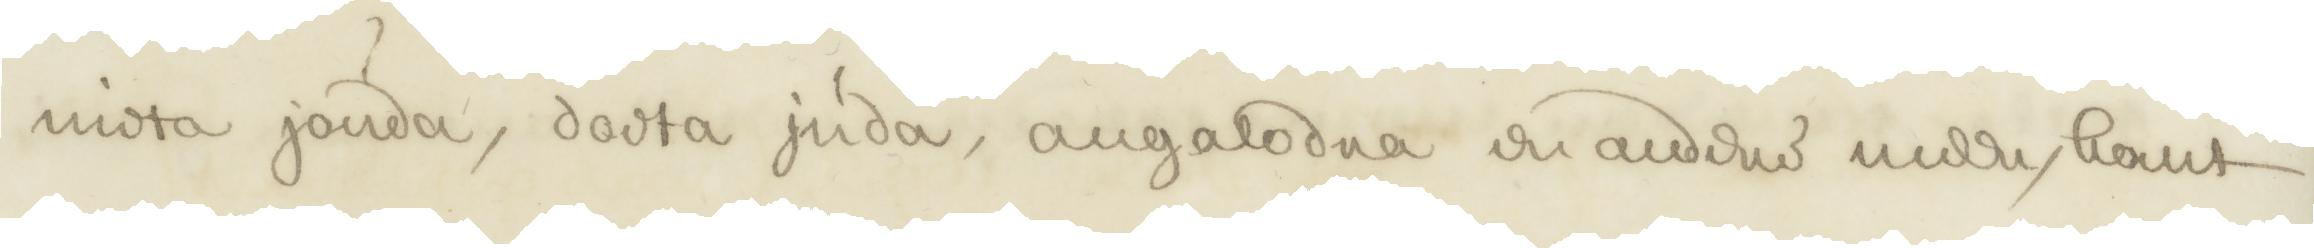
nieta jouda, doeta juda, angalodra en andere meer, kant
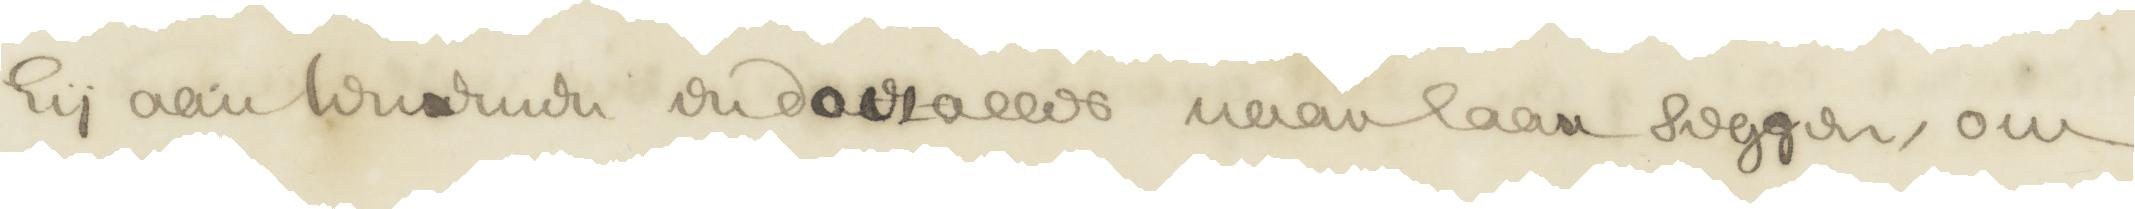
hij aan tenemen en doet alles naar haar seggen, om
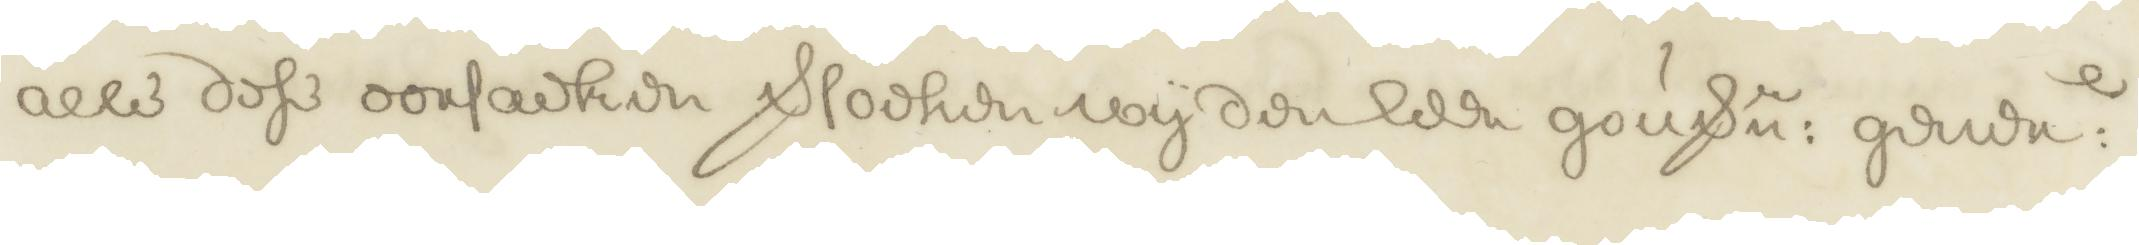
alle dese oorsaeken versoeken wij den heer gouvern:r gener:l
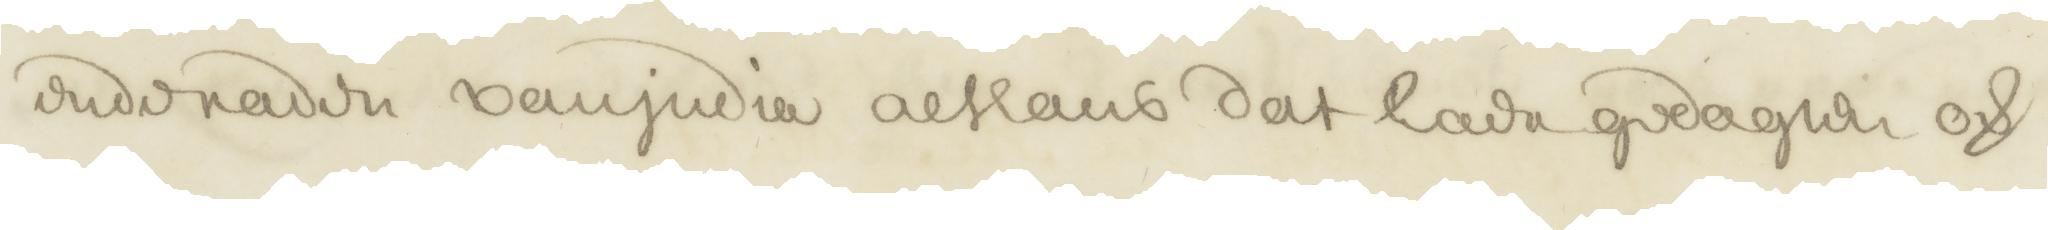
ende raden van jndia althans dat haer gedagten over
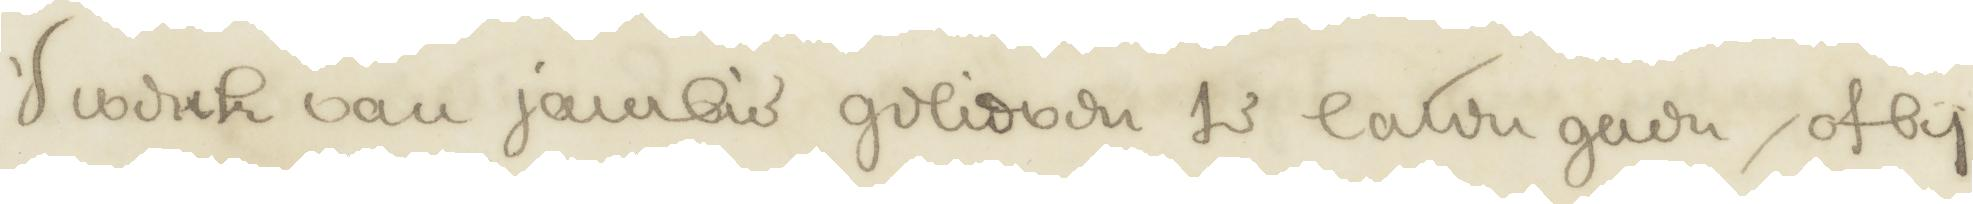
't werk van jambie gelieven te laten gaen, of bij
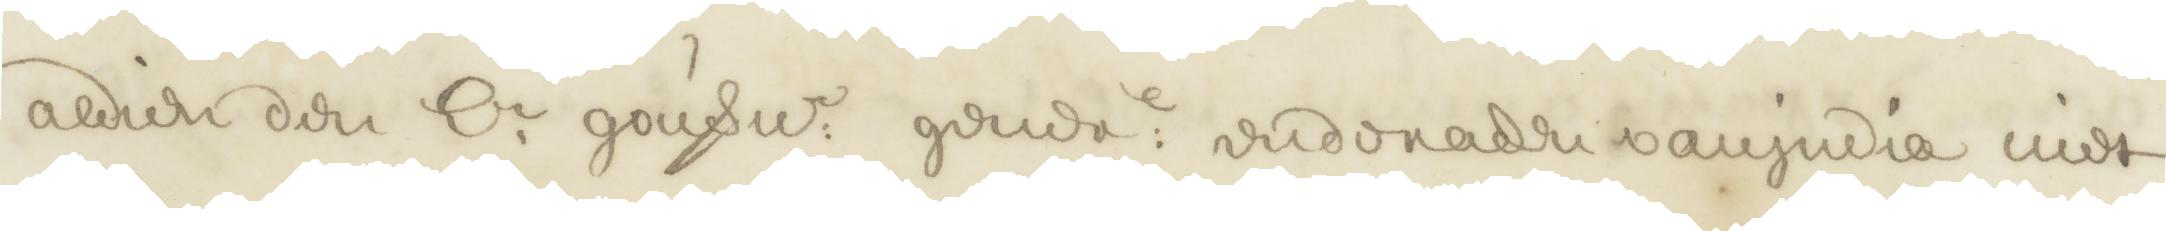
aldien den h„r gouvern:r gener:l ende raden van jndia niet
